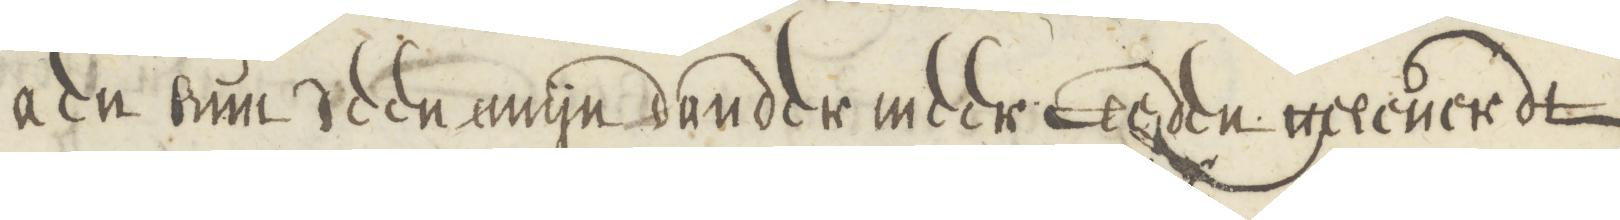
aen hun t een mijn dan der meer cleden geleuerdt
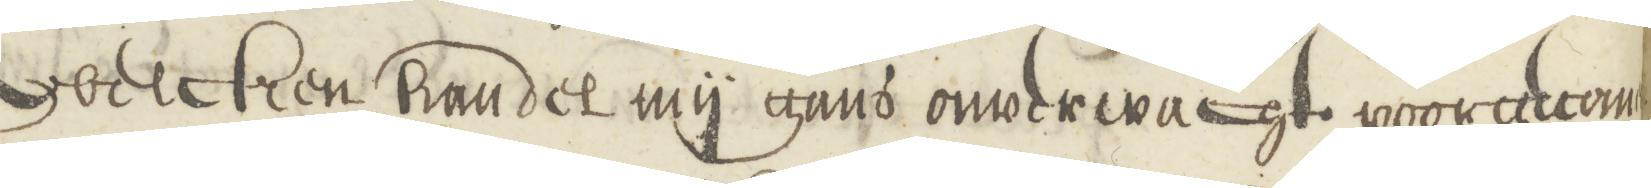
welcke handel mij gans onverwacht voorgecom
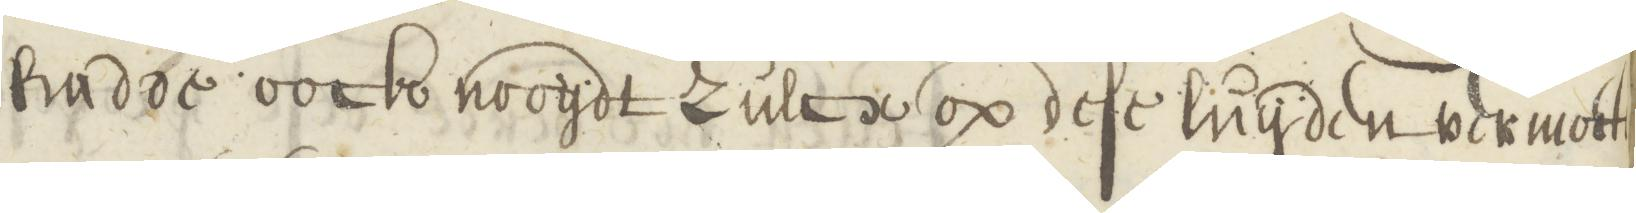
hadde oock nooydt zulcx op dese luijden vermoet
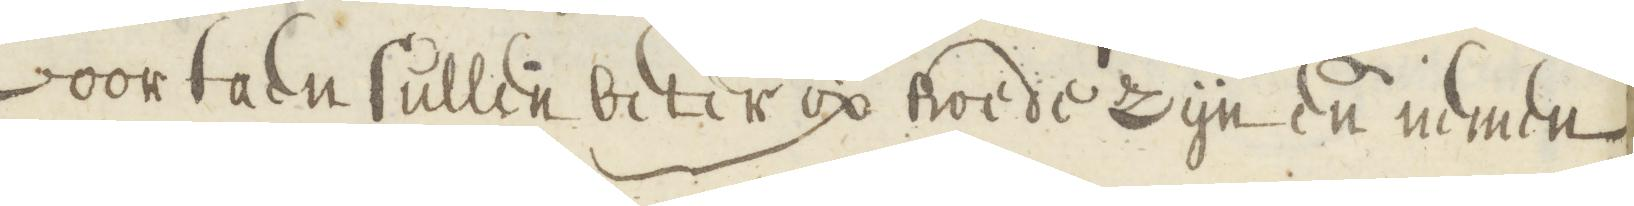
voortaen sullen beter op hoede zijn ende nemen
